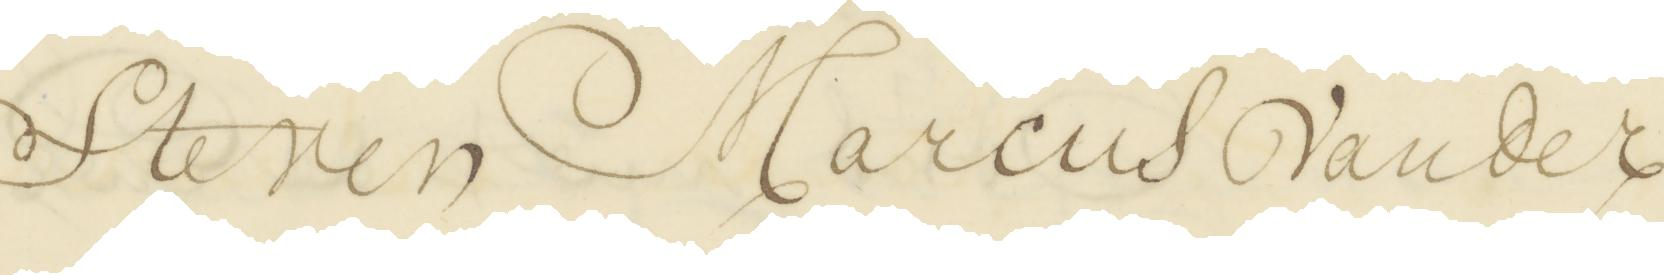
Steven Marcus van der
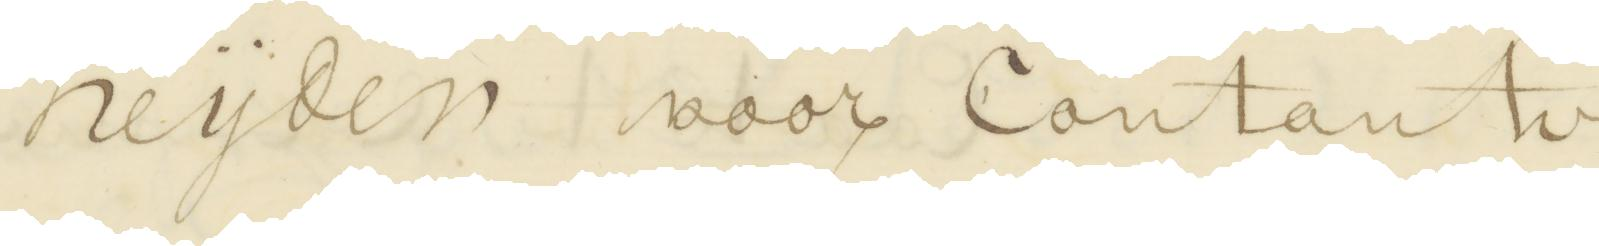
heijden voor Contante
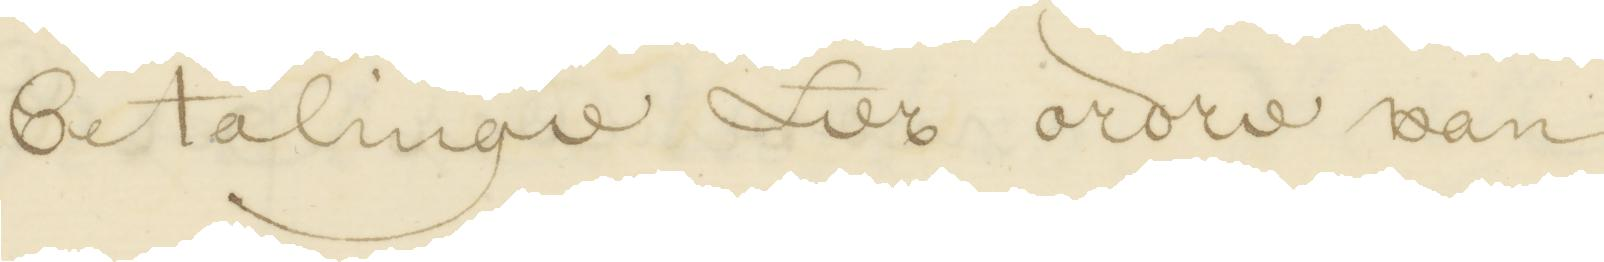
betalinge ter ordre van
